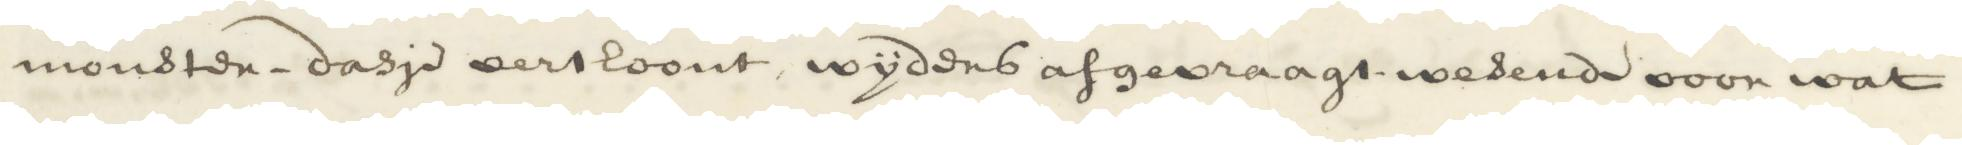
monster-dasje verthoont, wijders afgevraagt wesende voor wat
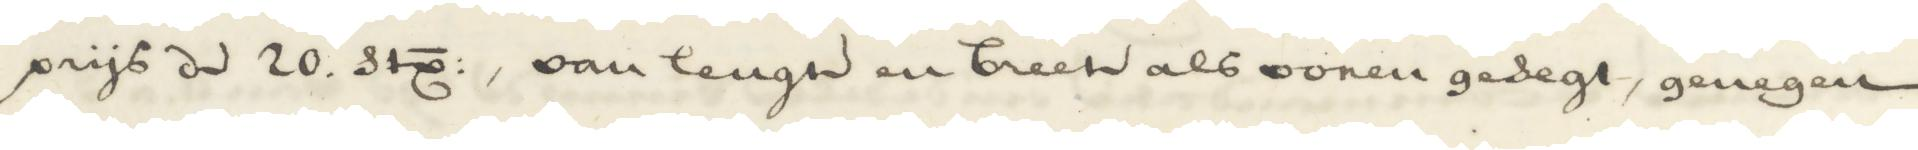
prijs de 20. stx:, van lengte en breete als voren gesegt, genegen
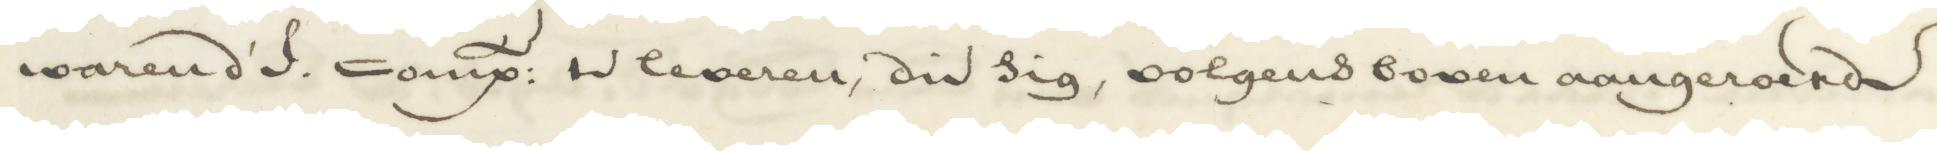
waren d' E. comp: te leveren, die sig, volgens boven aangeroerde
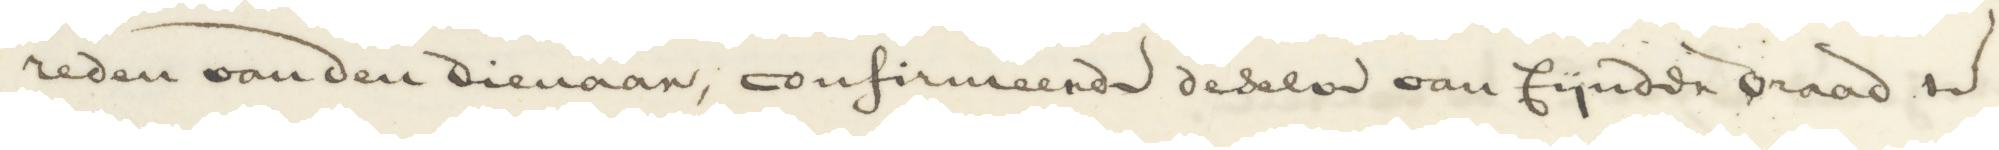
reden van den dienaar, confirmeerde deselve van fijnder draad te
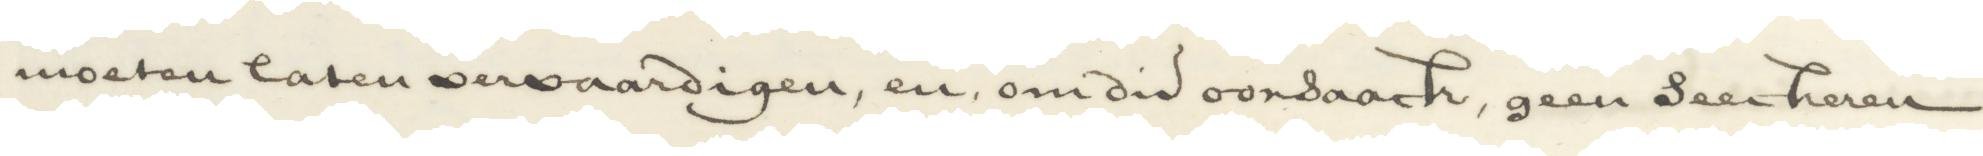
moeten laten vervaardigen, en, om die oorsaack, geen seeckeren
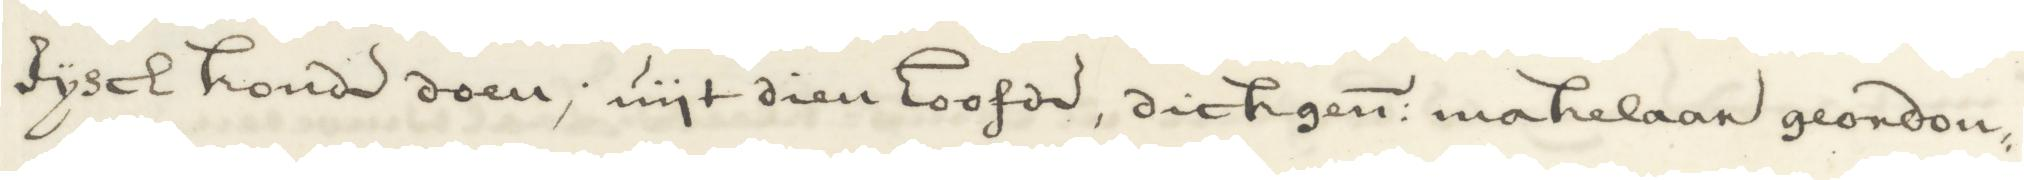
Eijsch konde doen; uijt dien hoofde, dickgen: makelaar geordon„
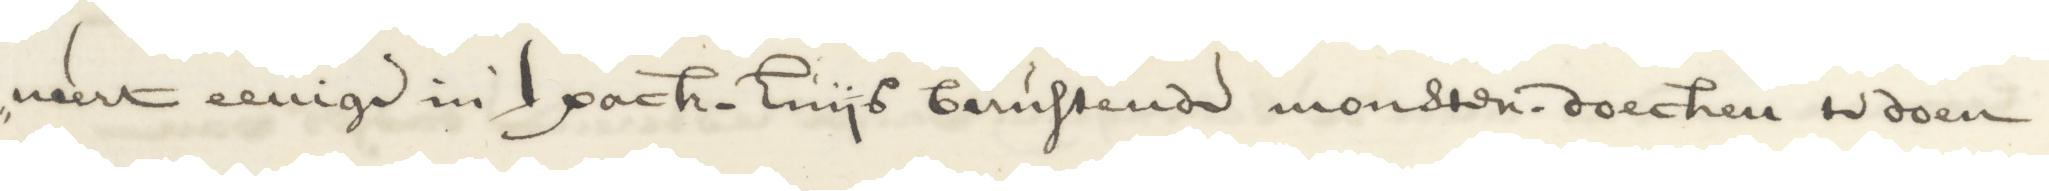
„neert eenige in ’t pack-huijs berustende monster-doecken te doen
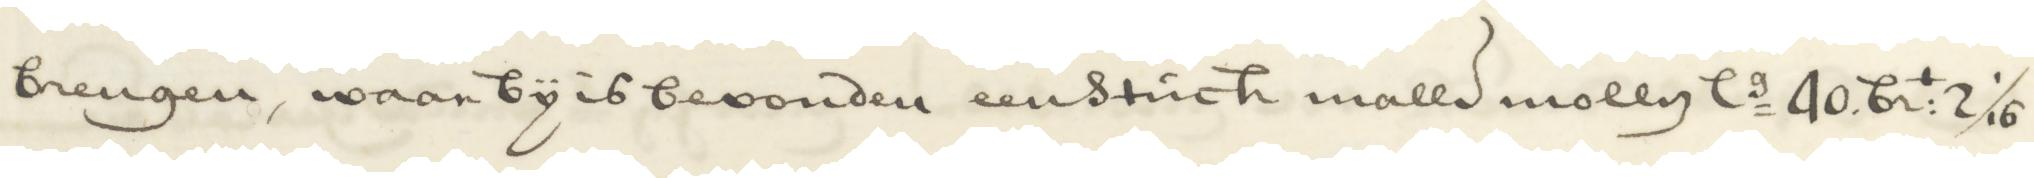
brengen, waar bij is bevonden een stuck malle mollen l=9 40. br:t 1/16
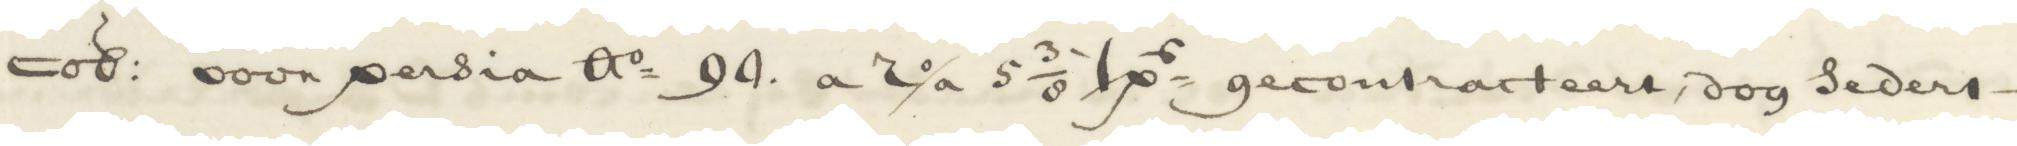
cob: voor persia a=o 94. â r o/a 5 3/8 'tp=s gecontracteert, dog sedert
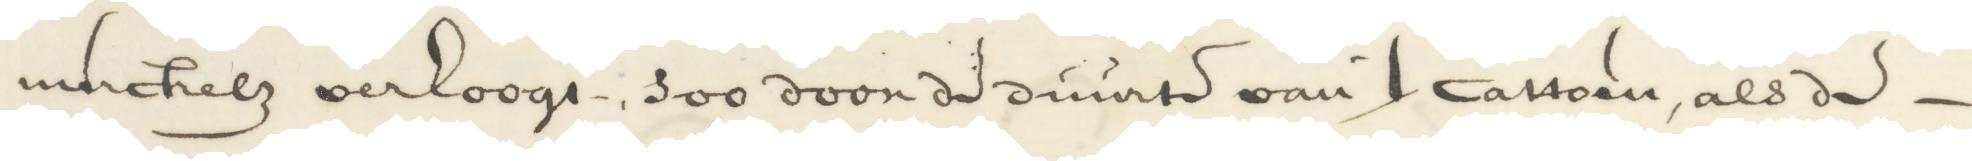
merckelijk verhoogt, soo door de duurte van ’t cattoen, als de
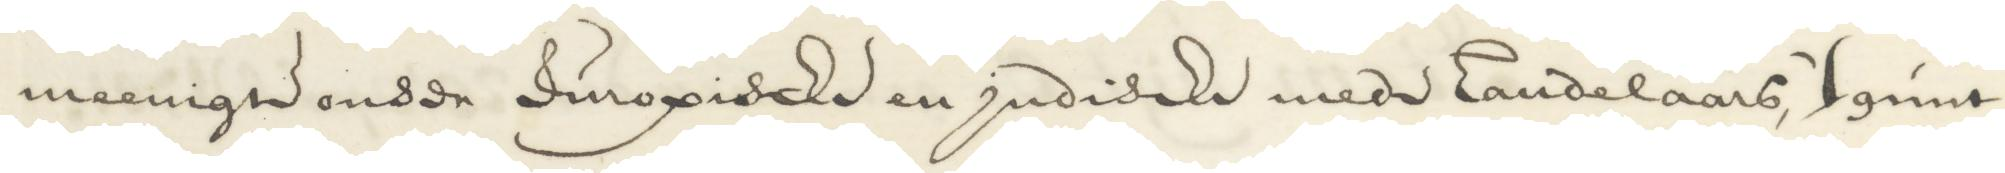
meenigte onser Europische en jndisch mede handelaars, 't gunt
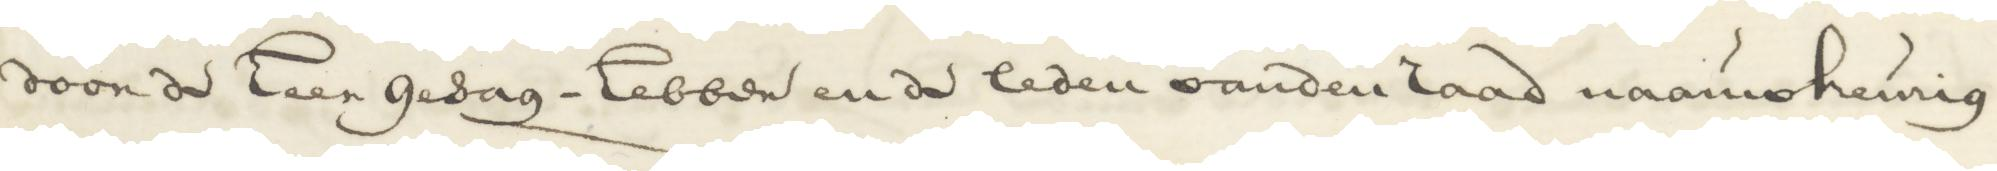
door de heer gesag-hebber en de leden van den raad naauwkeurig
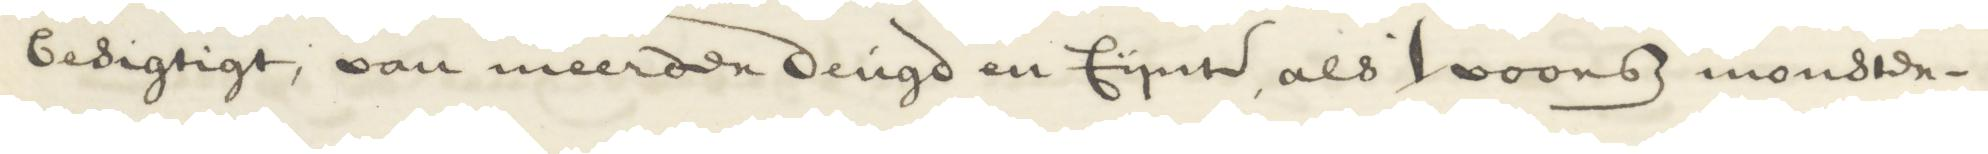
besigtigt; van meerder deugd en fijnte, als 't voorsz monster-
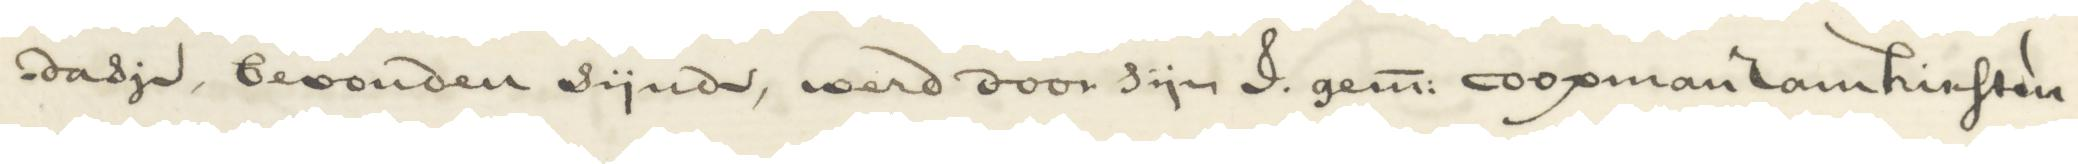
-dasje, bevonden sijnde, werd door sijn E. gem: coopman ramkirsten
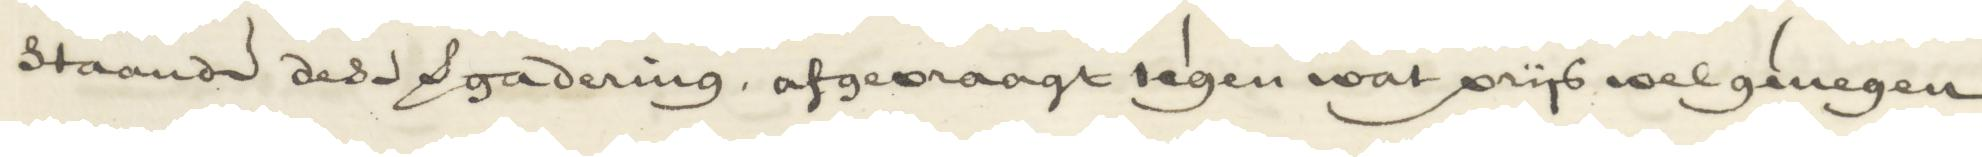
staande dese vergadering, afgevraagt tegen wat prijs wel genegen
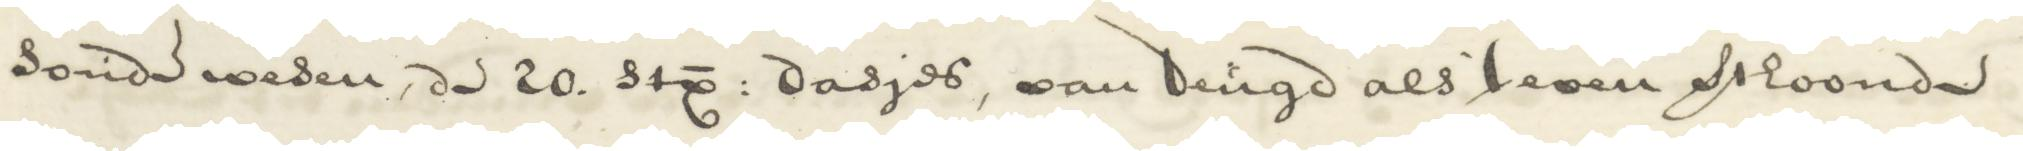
soude wesen, de 20. stx: dasjes, van deugd als 't even verthoonde
